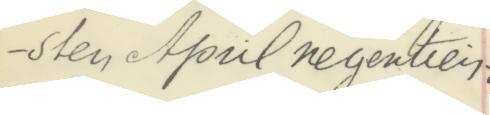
sten April negentien
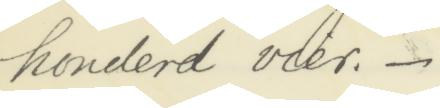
honderd vier.—
